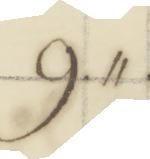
9. „
